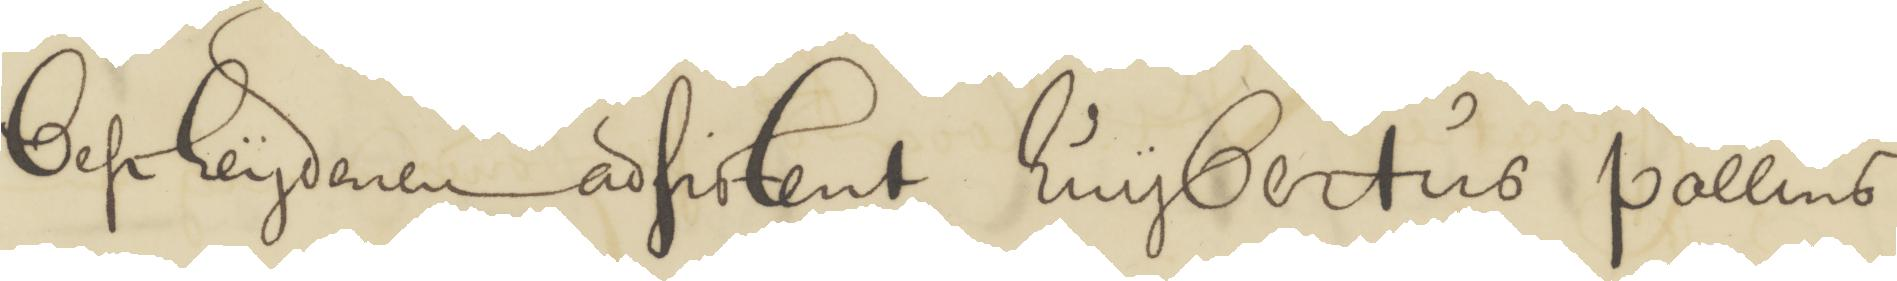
bescheijdenen adsistent huijbertus pallius
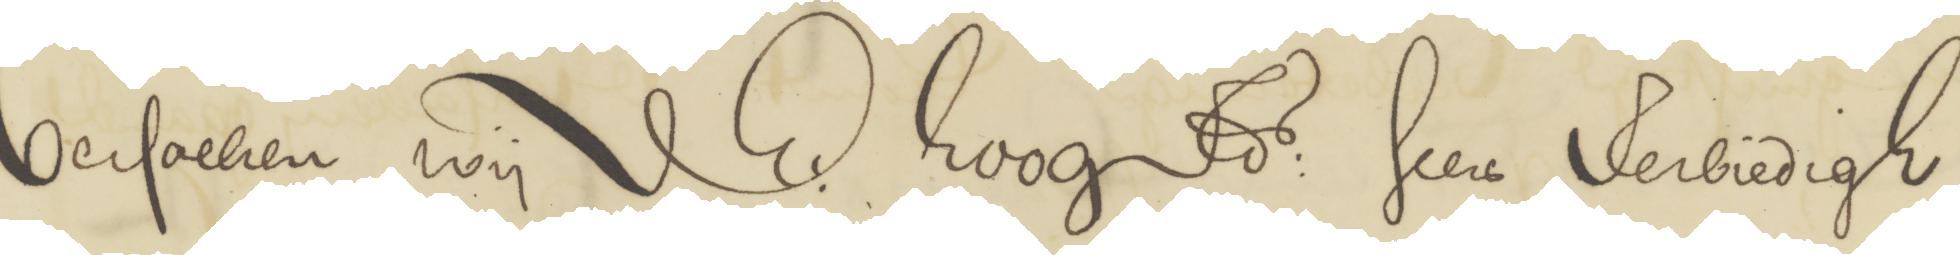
versoeken wij VE: hoog Ed:s seer Eerbiedigh
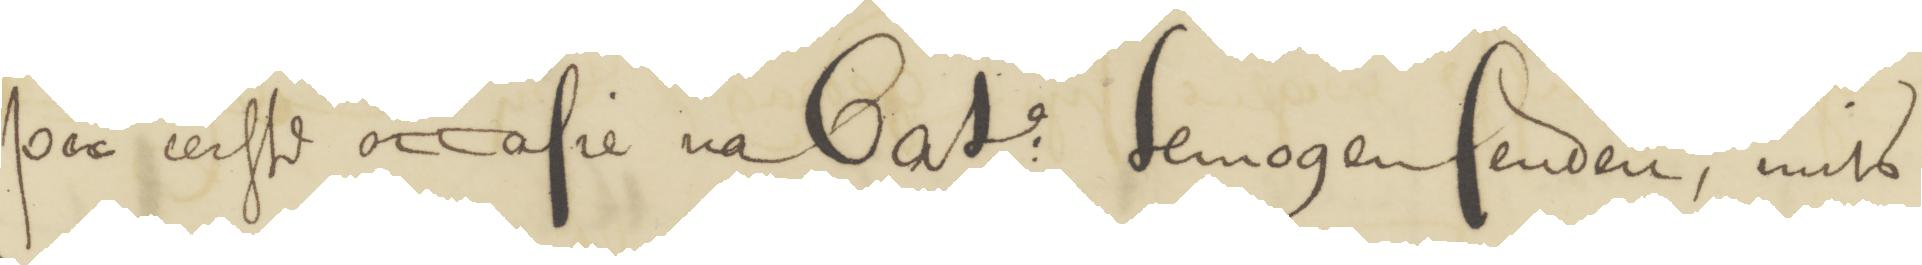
per eerste occasie na bat:a te mogen senden, mits
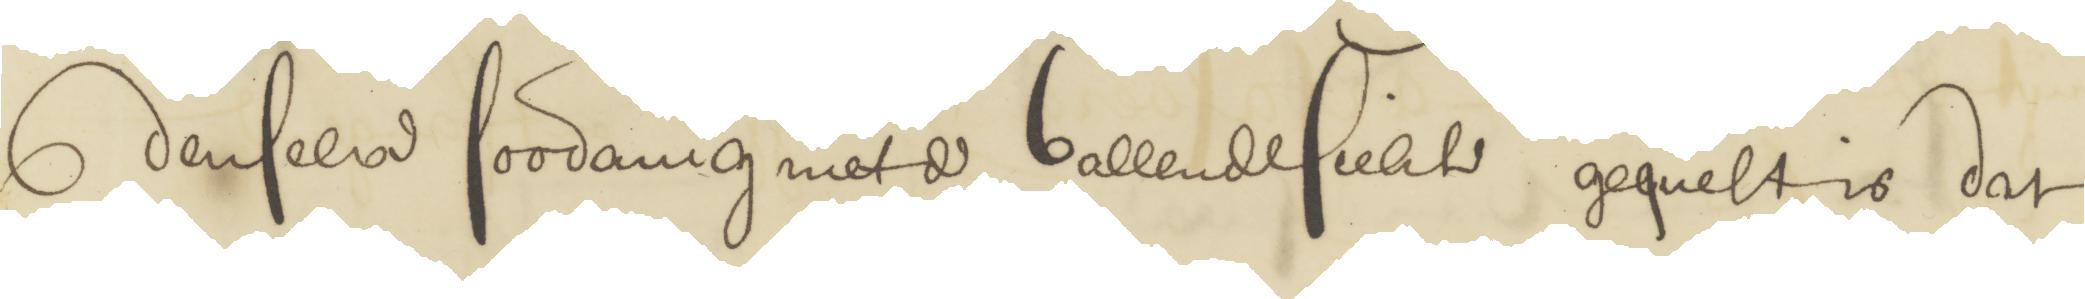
denselve soodanig met de ballende siekte gequelt is dat
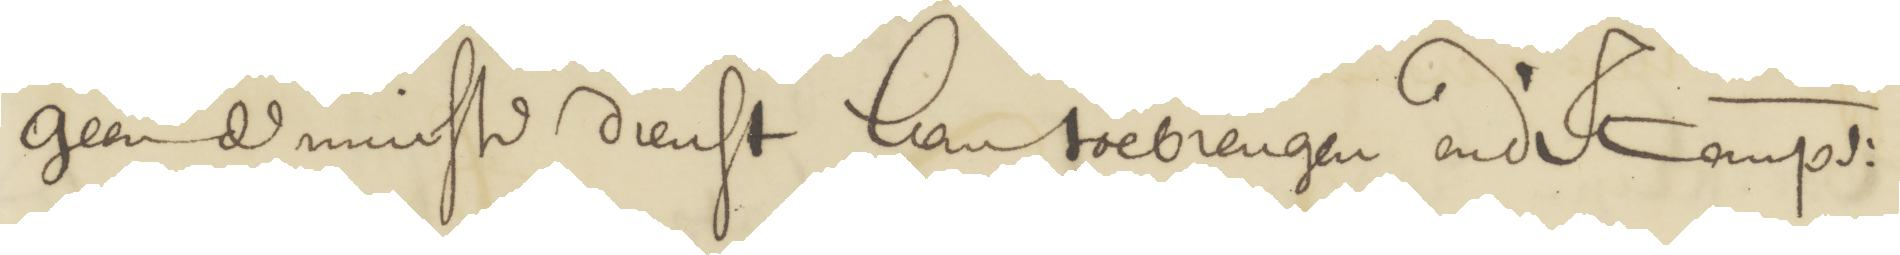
geen de minste dienst kan toebrengen en d'EComps:
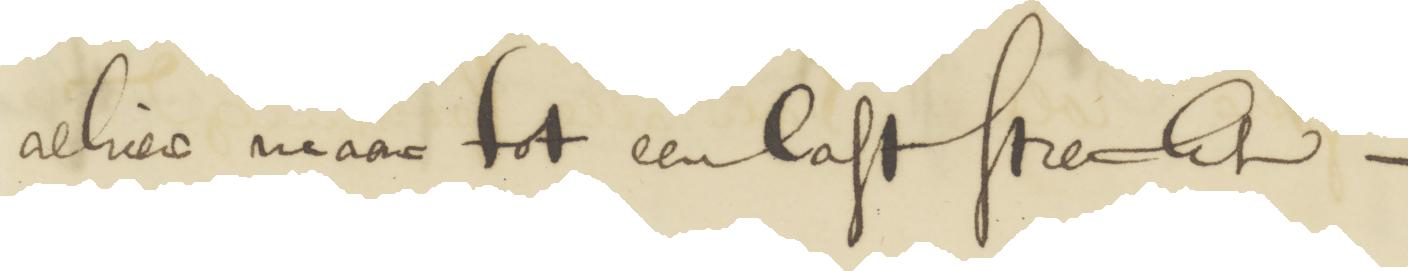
alhier maar tot een last streckt
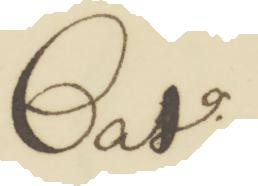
bat:a
